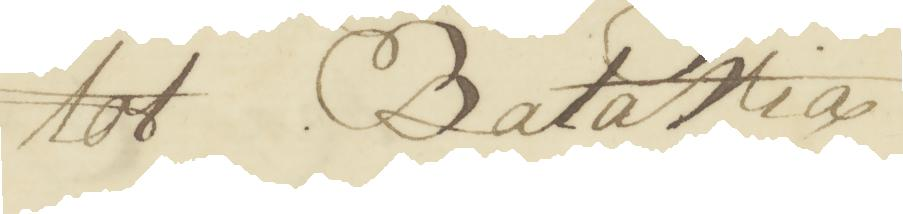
tot Batavia
